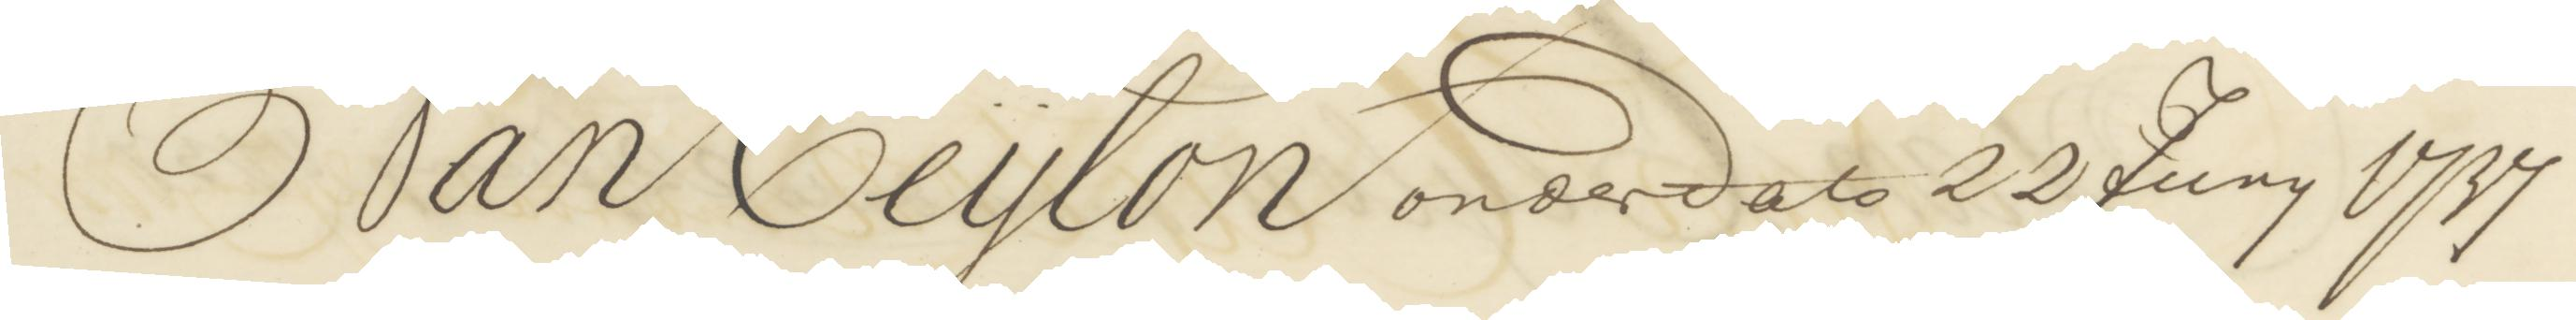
Van Ceijlon onderdato 22 Juny 1737
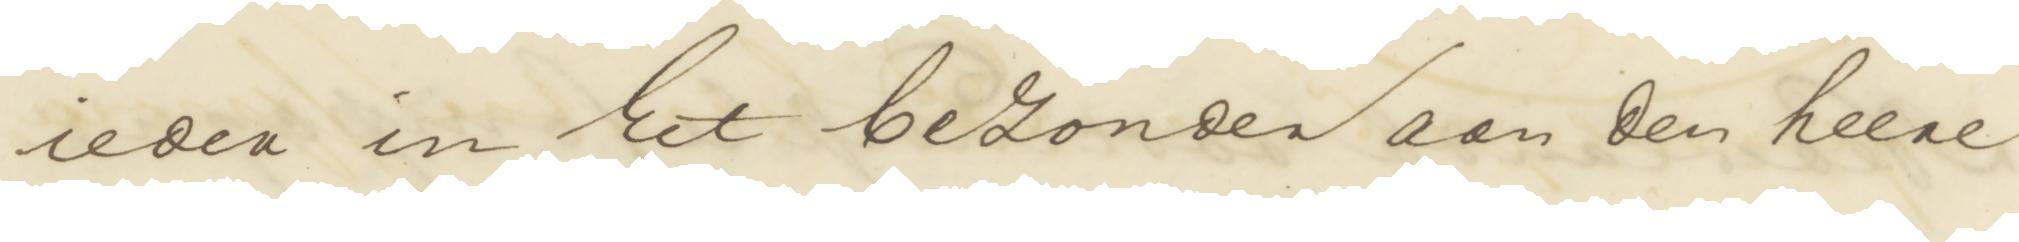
ieder in het bezonden aan den heere
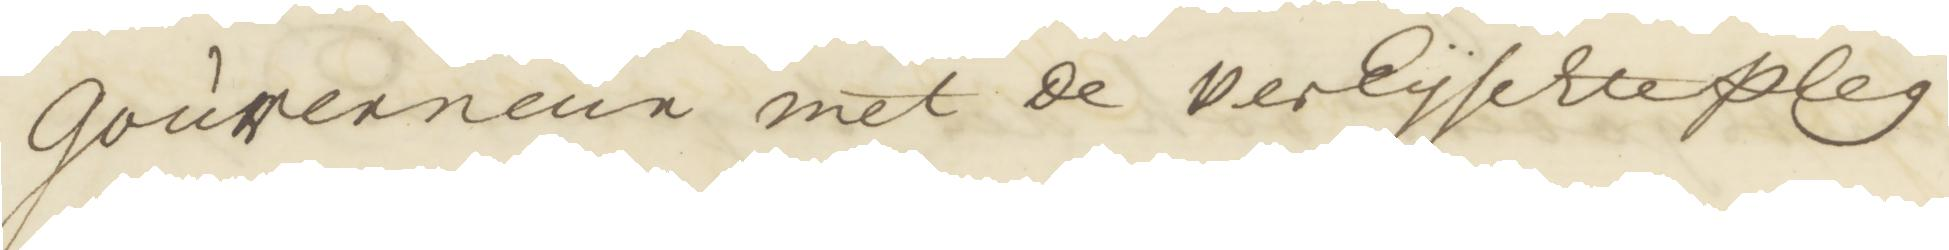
gouverneur met de verEyschte pleg
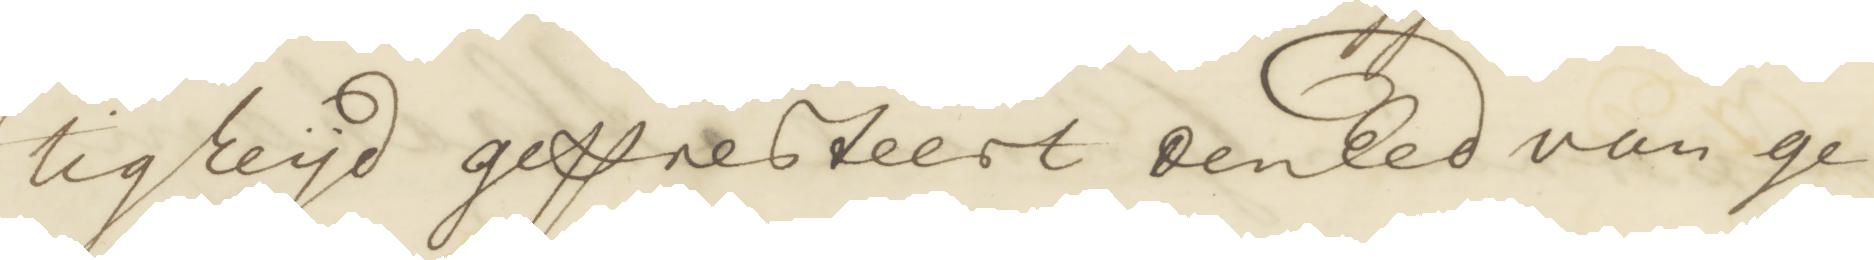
tigheijd gepresteert den Eed van ge
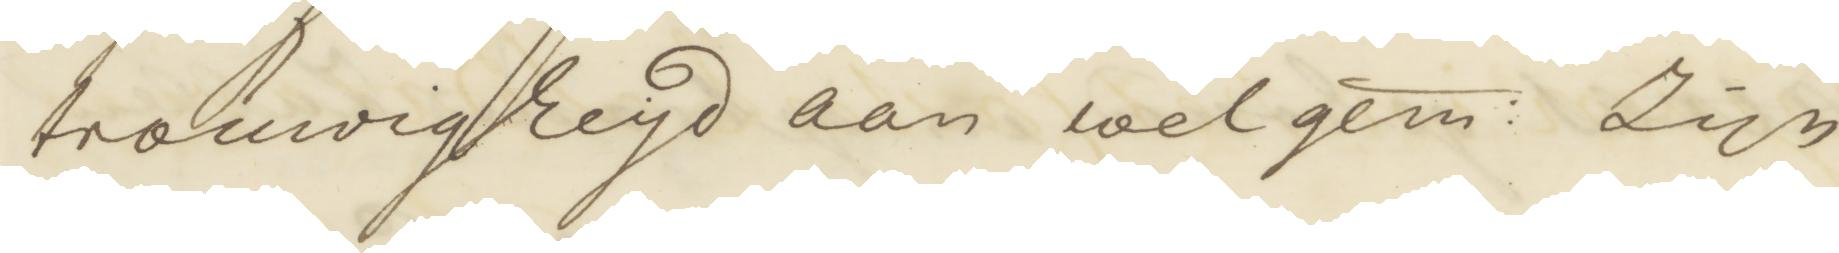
trouwigheijd aan wel gem: zijn
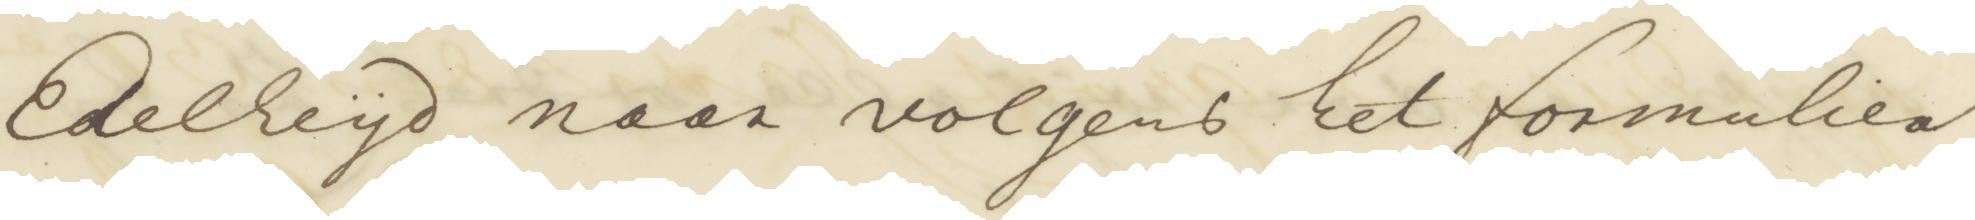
Edelheijd naar volgens het formulier
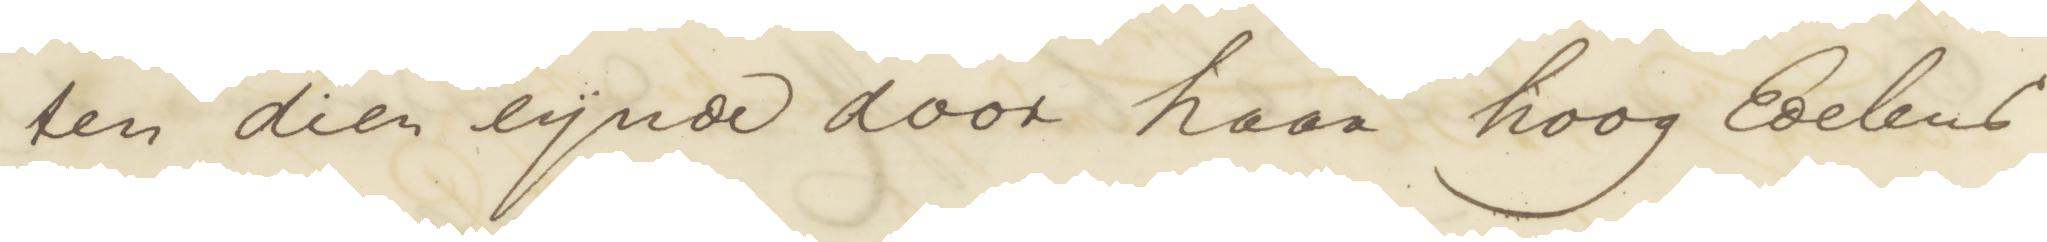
ten dien eijnde door haar hoog Edelens
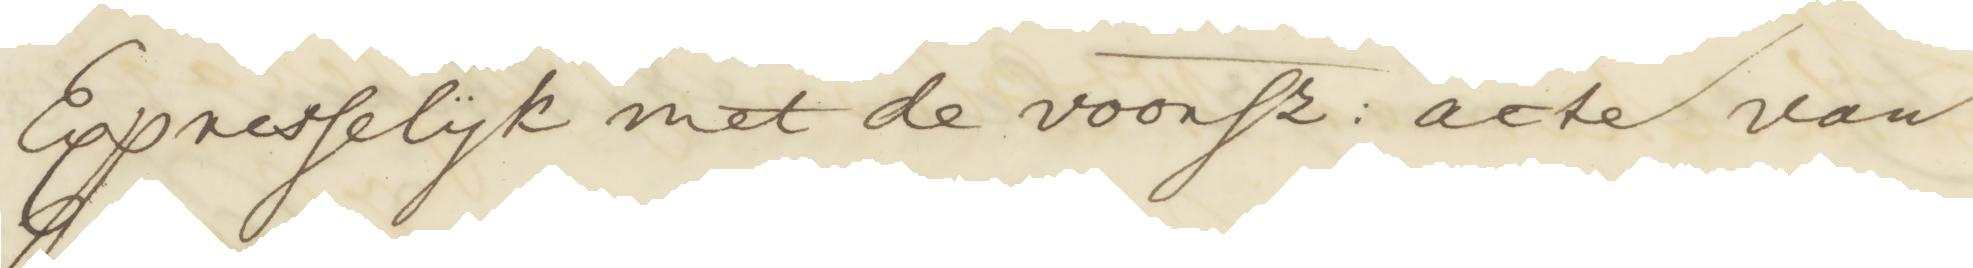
Expresselijk met de voorsz: acte van
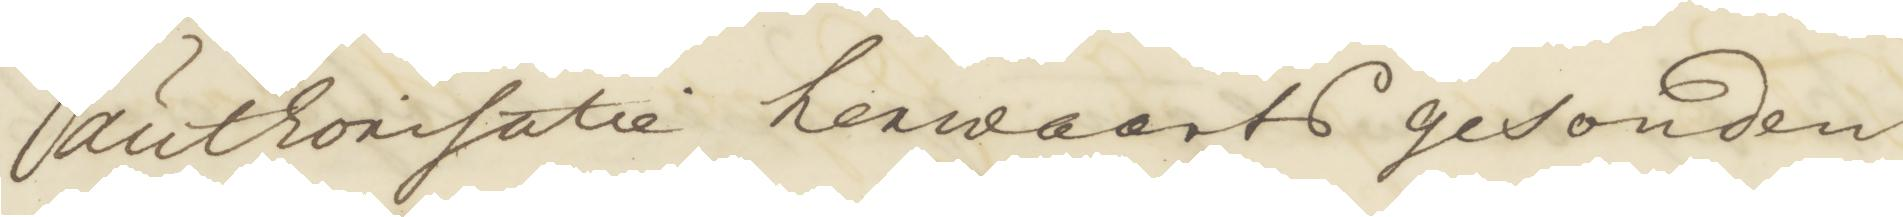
authorisatie herwaarts gesonden
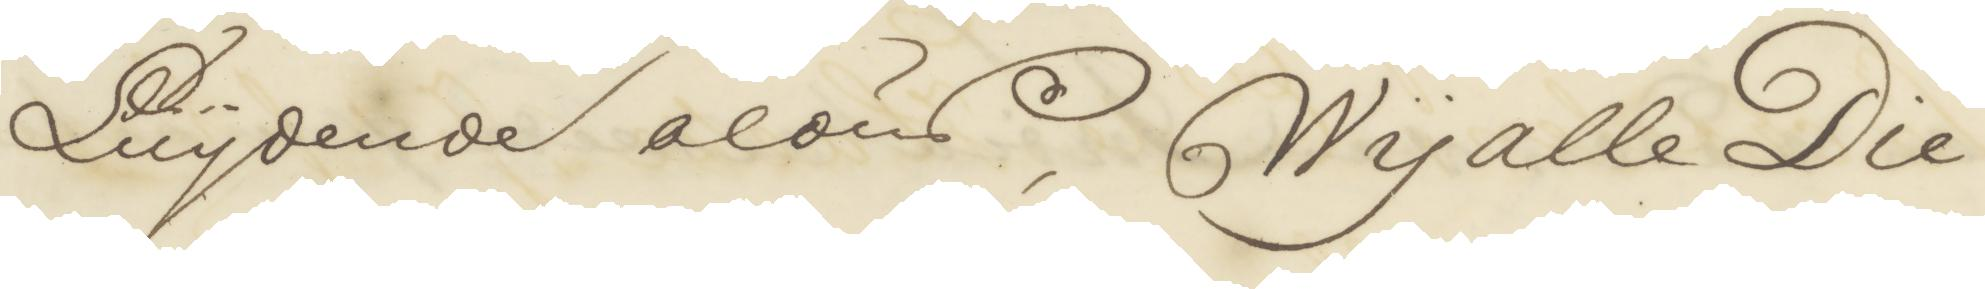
Luijdende aldus Wij alle Die
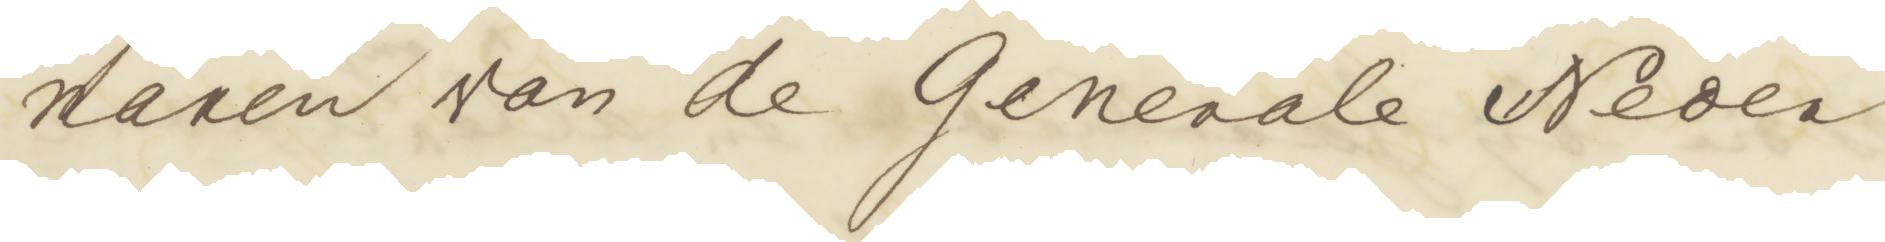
naren van de Generale Neder
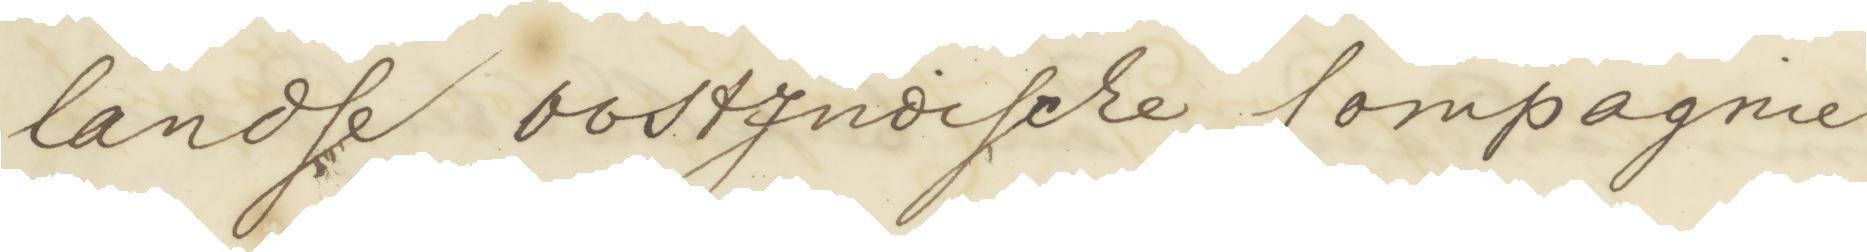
landse oostjndische Compagnie
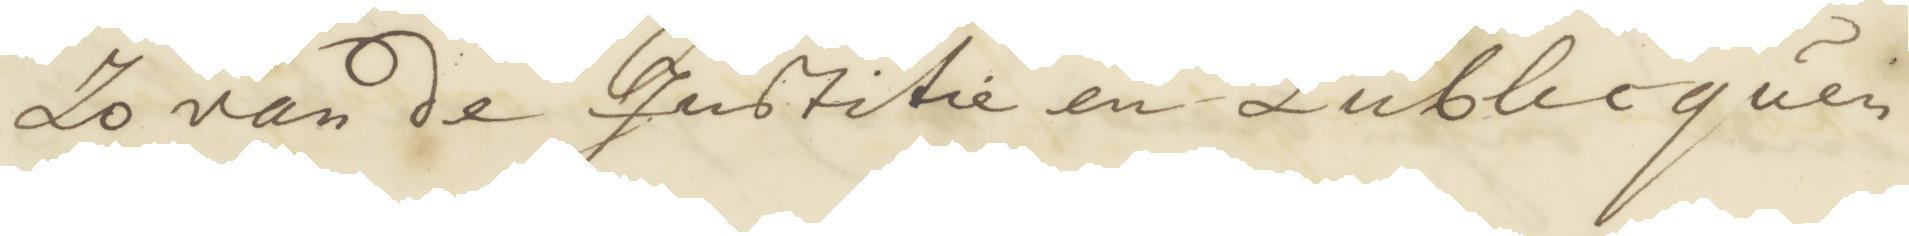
zo van de Justitie en Publicquen
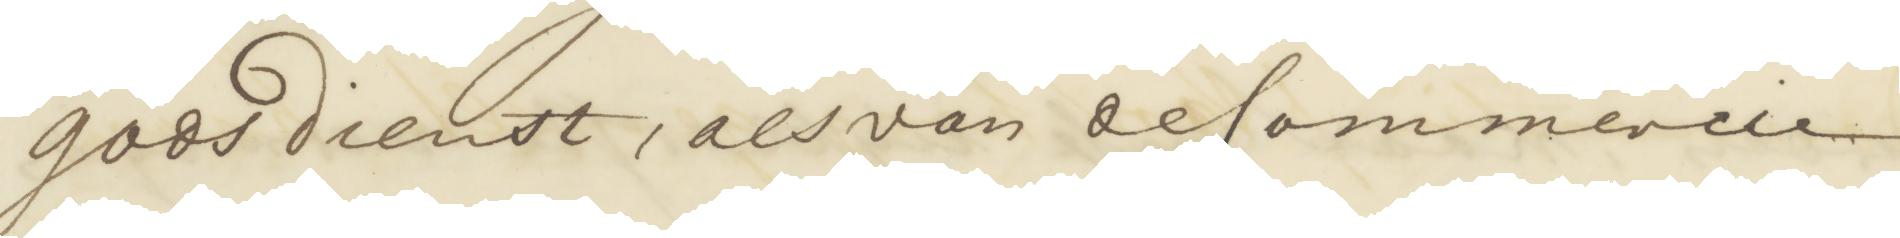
godsdienst, als van de commercie
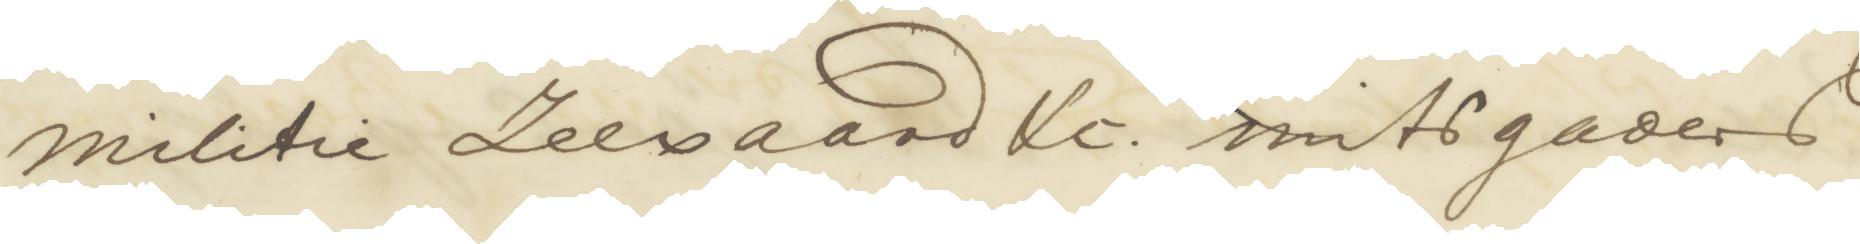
militie zeevaard &c. mitsgaders
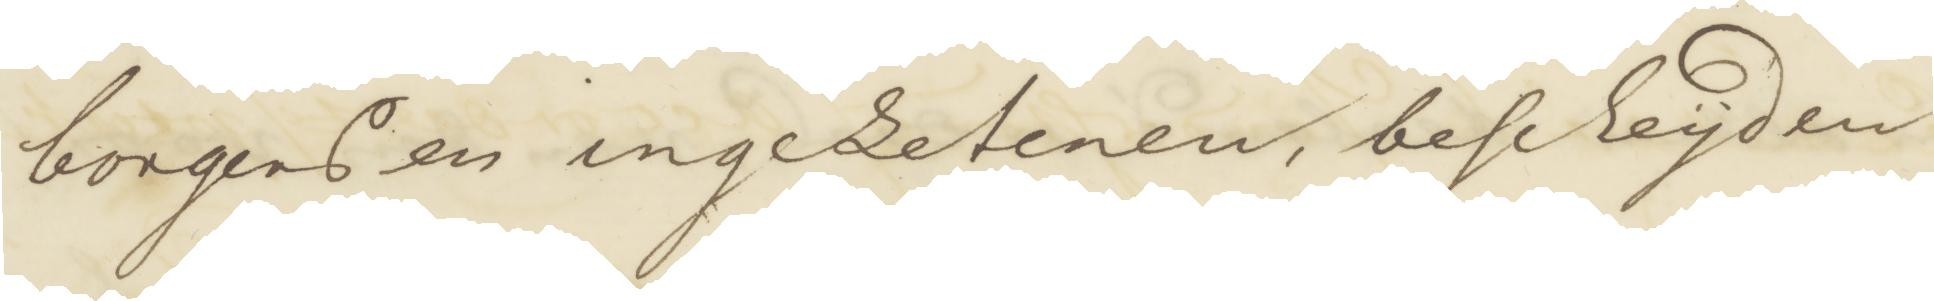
borgers en ingezetenen, bescheijden
